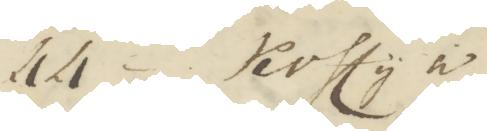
44 —. Koffij a
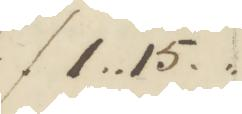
ƒ1..15. „
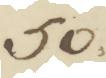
50:
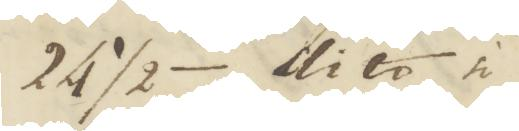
24½ — dito à
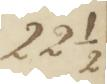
22½
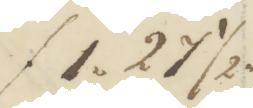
ƒ 1„27½„
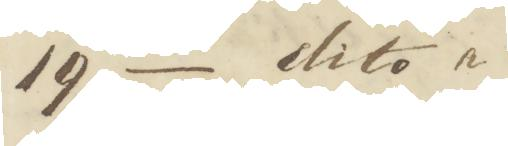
19 — dito a
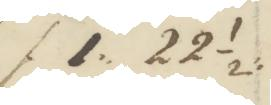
ƒ 1. 22½„
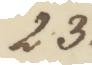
23:
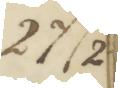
27½
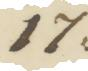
17:
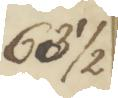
63½
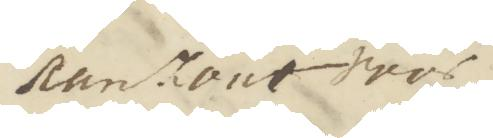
aan zout voor
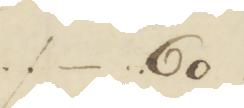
ƒ — :60
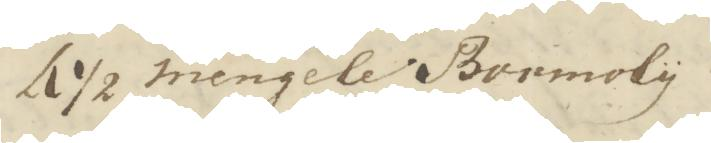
4½ mengele Boomolij
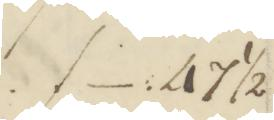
ƒ—:47½
